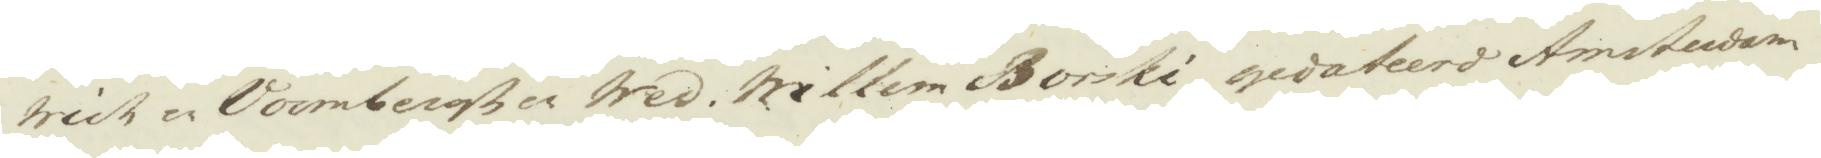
wich en Voombergh en Wed. Willem Borski, gedateerd Amsterdam
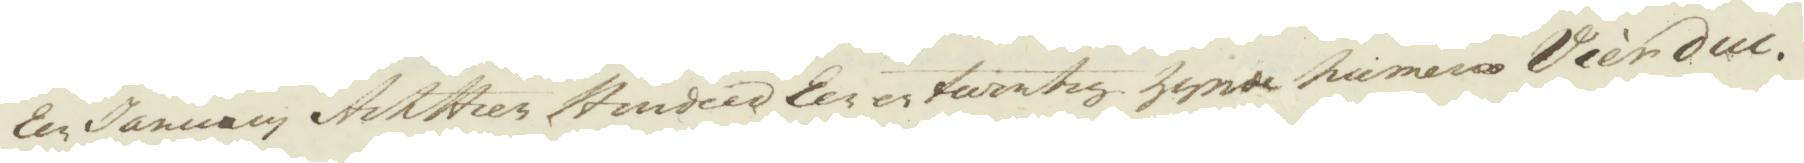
Een January Achttien Honderd Een en twintig Zynde numero Vier dui.
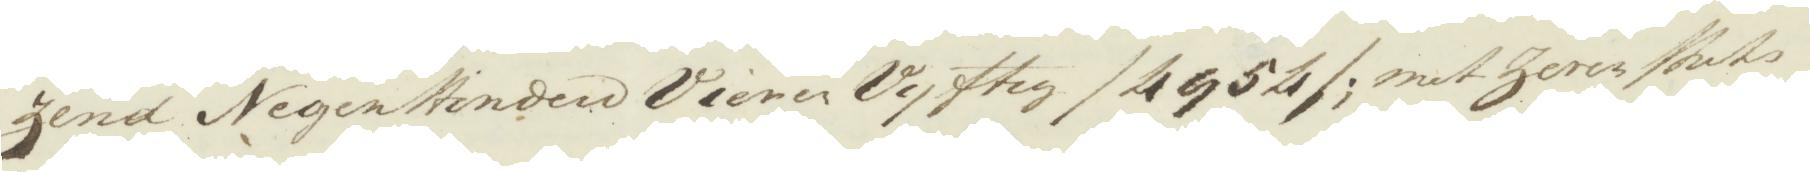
Zend Negen Honderd Vier en Vyftig /4954/; met Zeven stuks
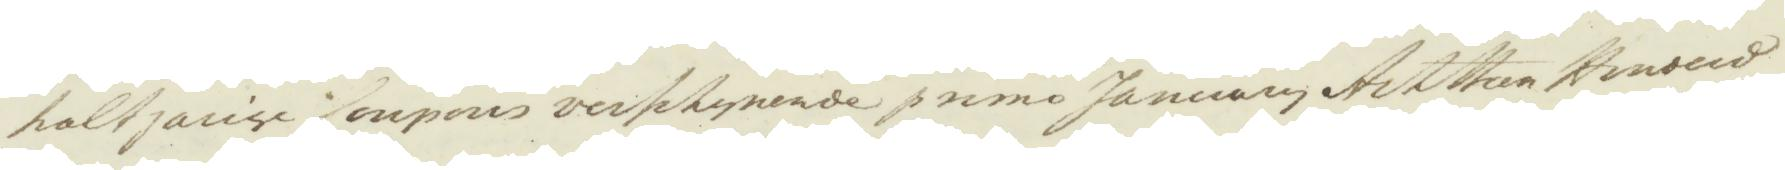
halfjarige Coupons verschynende primo January Achttien Honderd
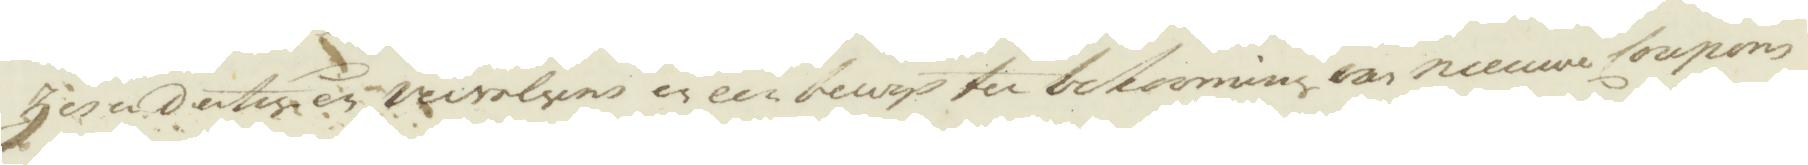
Zes en dertig en vervolgens in een bewys ter bekooming van nieuwe Coupons
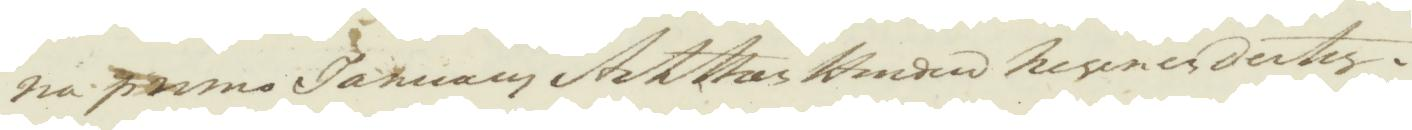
na primo Ianuary Achttien Honderd negen en dertig.
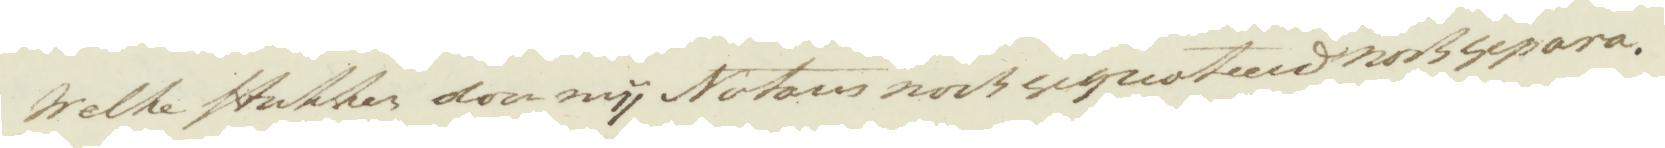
welke stukken door mij Notaris noch gequoteerd noch gepara.
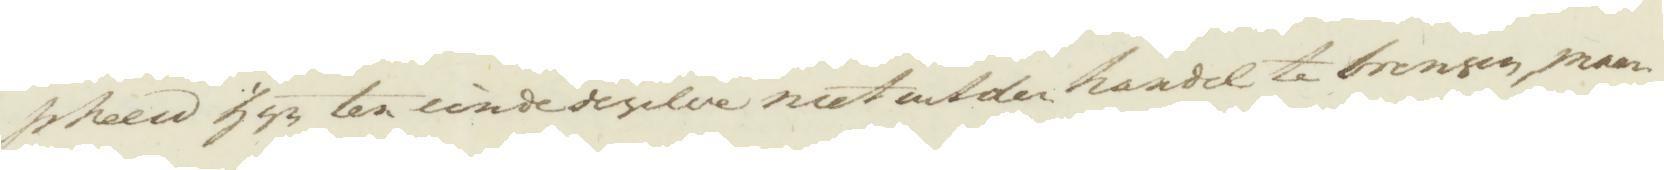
pheerd zijn ten einde dezelve niet uit den handel te brengen, maar
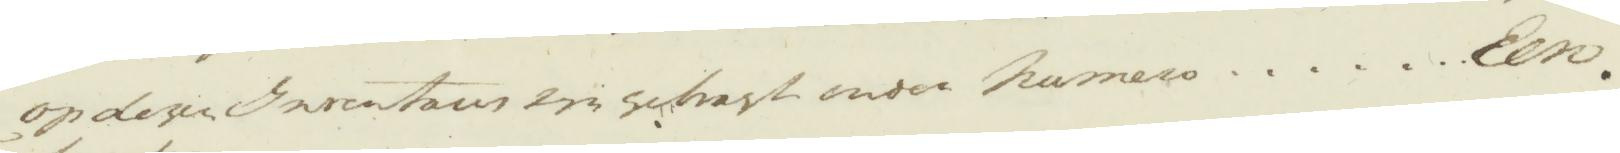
op dezen Inventaris zijn gebragt onder numero . . . . . . . Een.
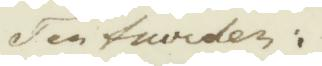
Ten tweeden:
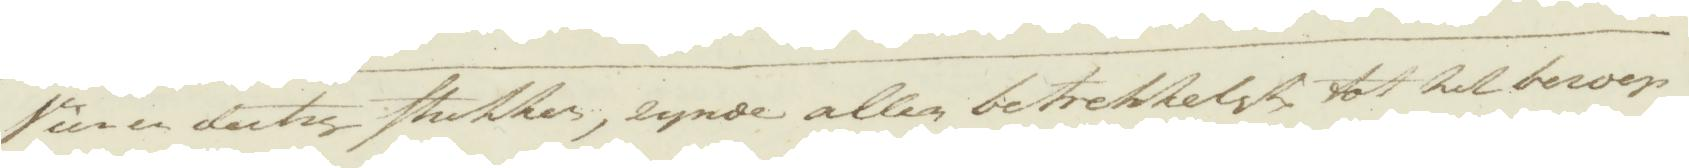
Vier en dertig stukken, zynde allen betrekkelyk tot het beroep
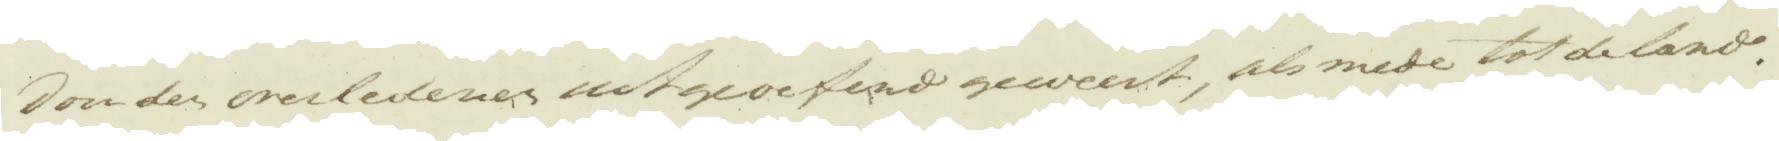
door den overledenen uitgeoefend geweest, als mede tot de land.
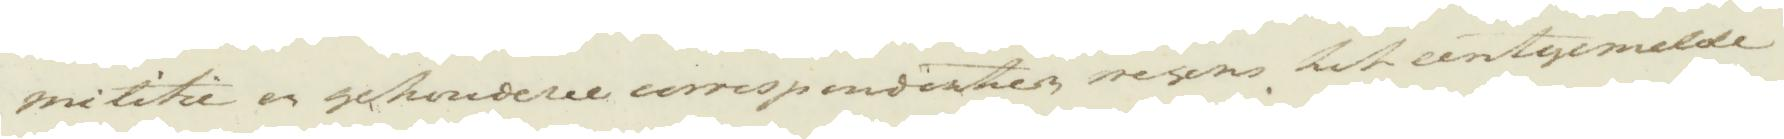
militie en gehoudene correspondentien wegens het eerstgemelde
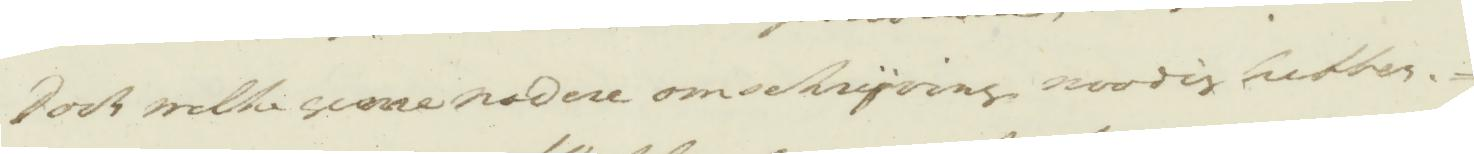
doch welke geene nadere omschrijving noodig hebben.
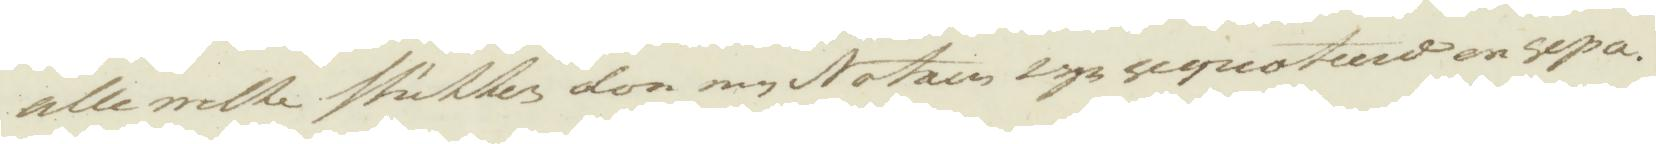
alle welke stukken don my Notaris zyn gequoteerd en gepa.
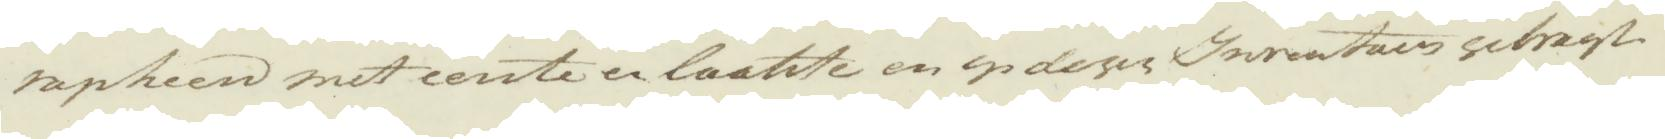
rapheerd met eerste en laatste en op dezen Inventaris gebragt
